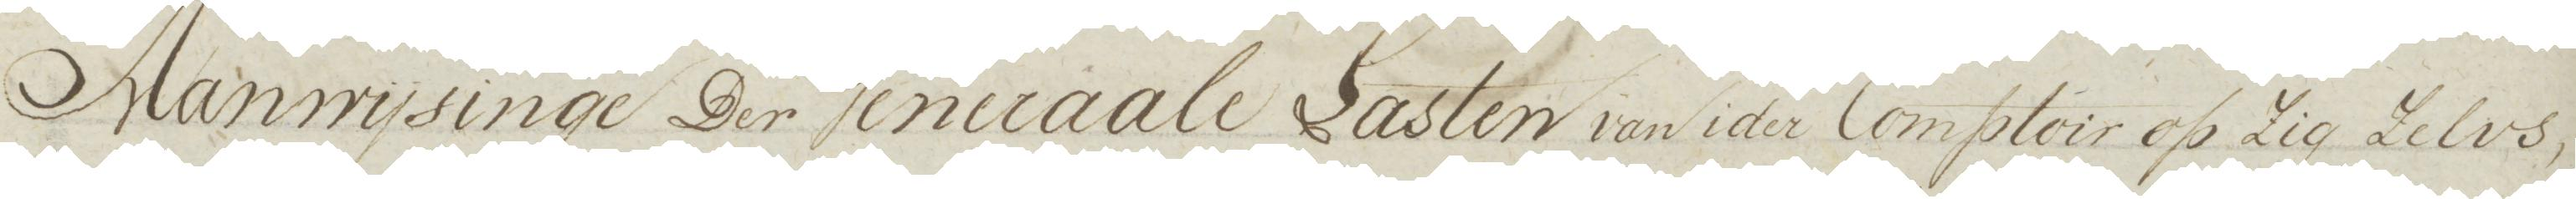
Aanwijsinge Der Generaale Lasten van ider Comptoir op zig zelvs,
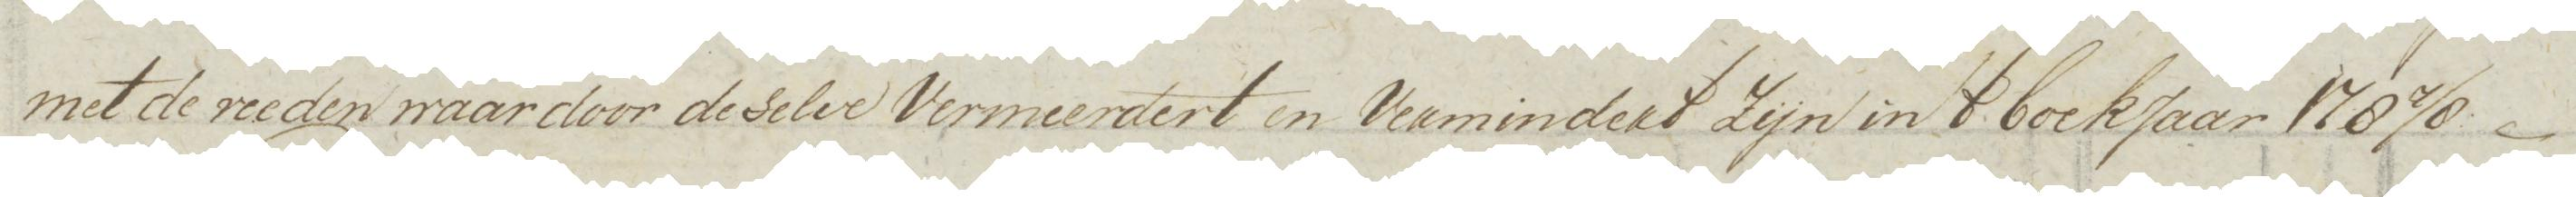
met de reeden waar door deselve vermeerdert en vermindert zijn in t boekjaar 1787/8
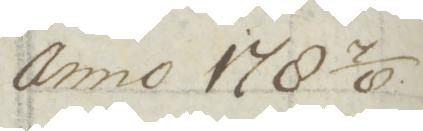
Anno 1787/8:
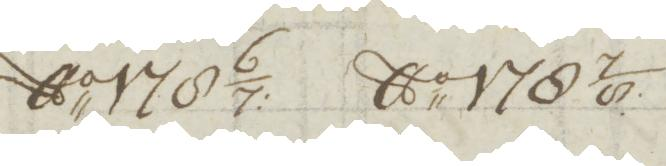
A„o1786/7: A„o 1787/8:
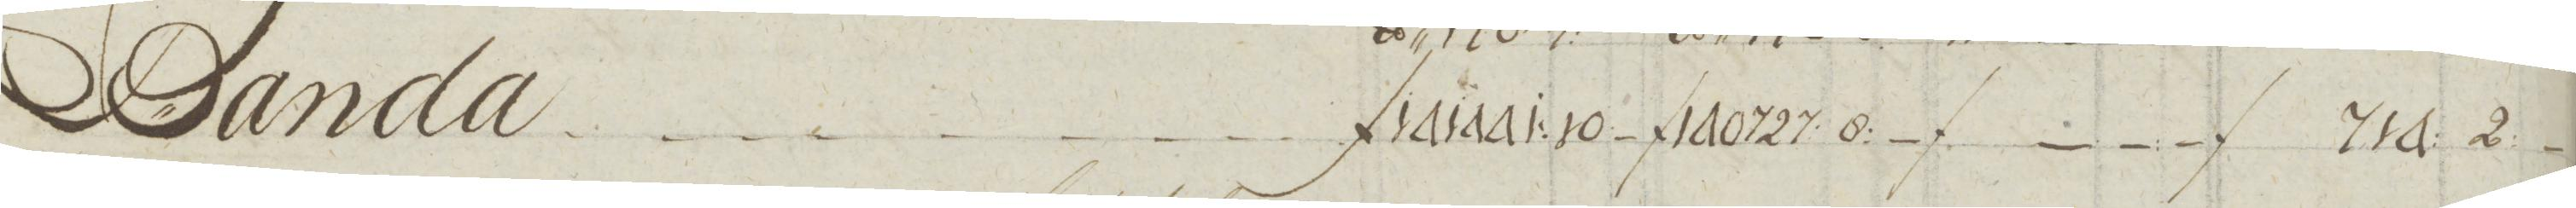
Banda - - - - - - - - - - ƒ141441: 10:— ƒ140727: 8: — ƒ —: —: — ƒ 714: 2: —
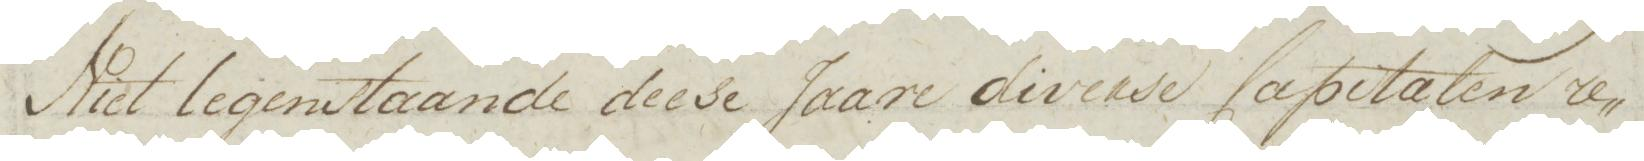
Niet tegenstaande deese Jaare diverse Capitalen re„
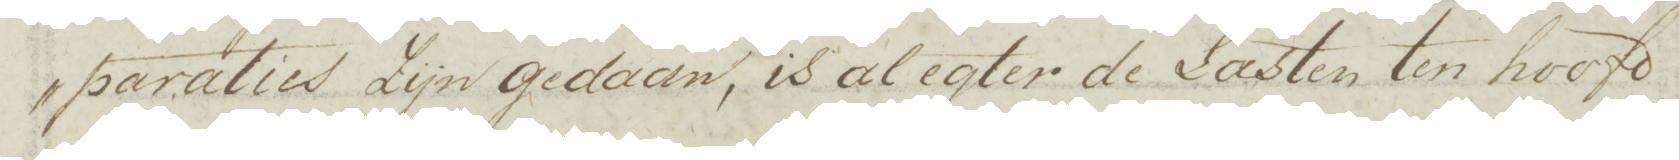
„paraties zijn gedaan, is al egter de Lasten ten hoofd
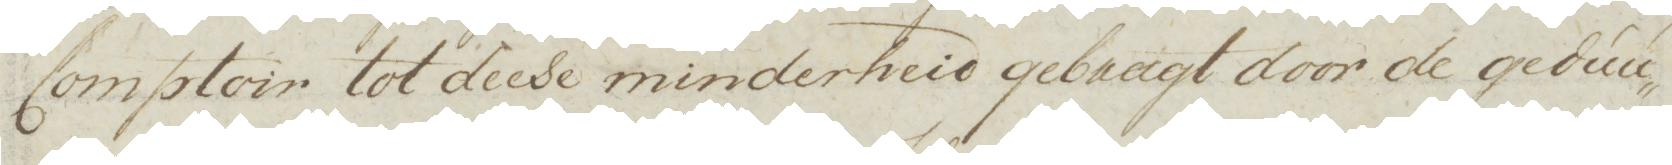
Comptoir tot deese minderheid gebragt door de geduu„
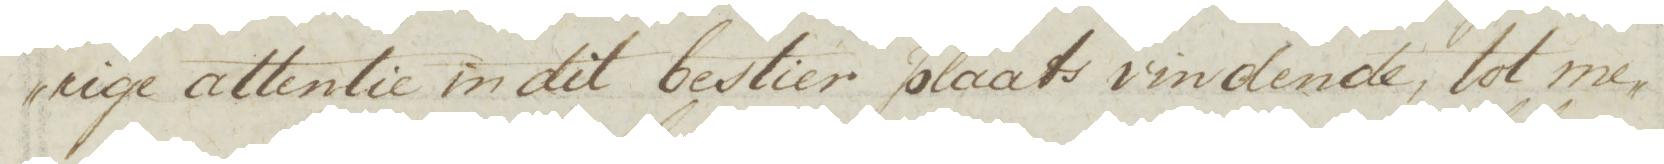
„rige attentie in dit bestier plaats vindende, tot me„
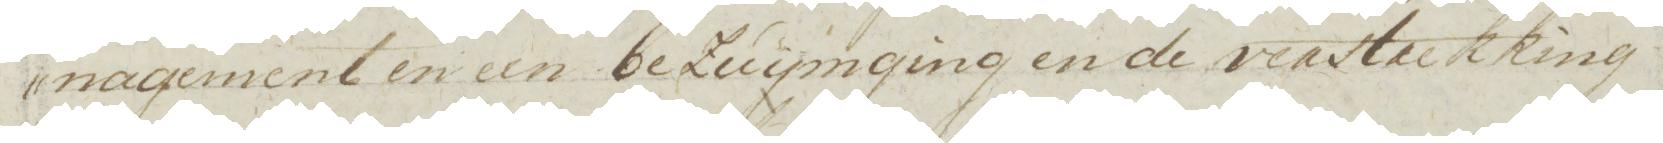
„nagement en een bezuijniging en de verstrekking
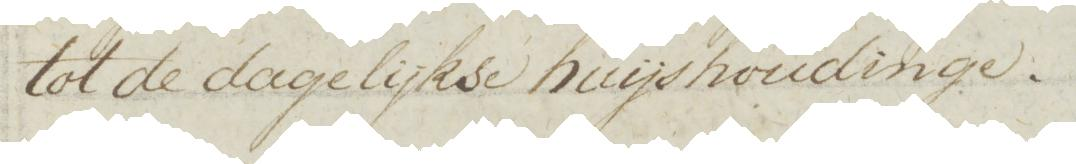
tot de dagelijkse huijshoudinge.
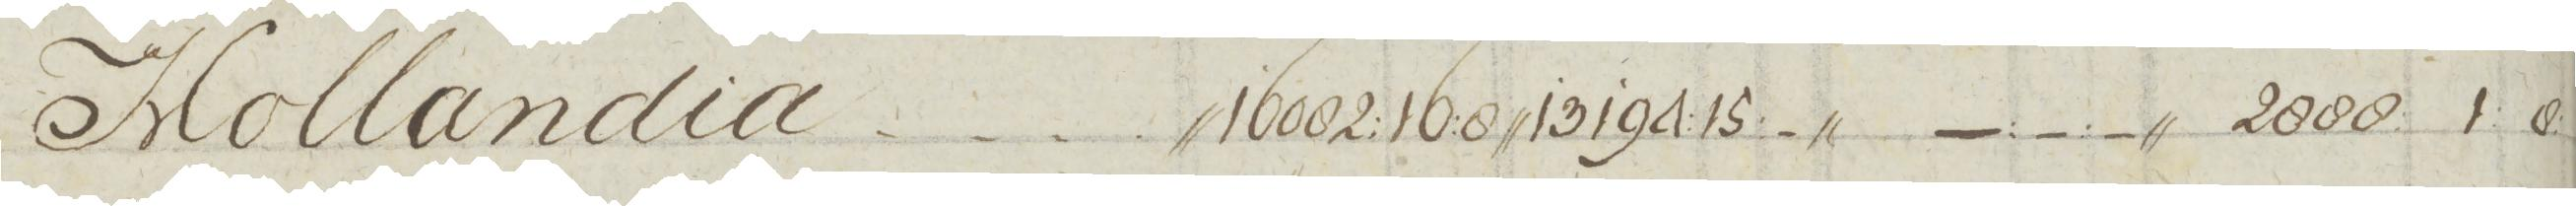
Hollandia - - - - „16082:16:8 „13194:15: - „ —: —: —„ 2888: 1: 8:
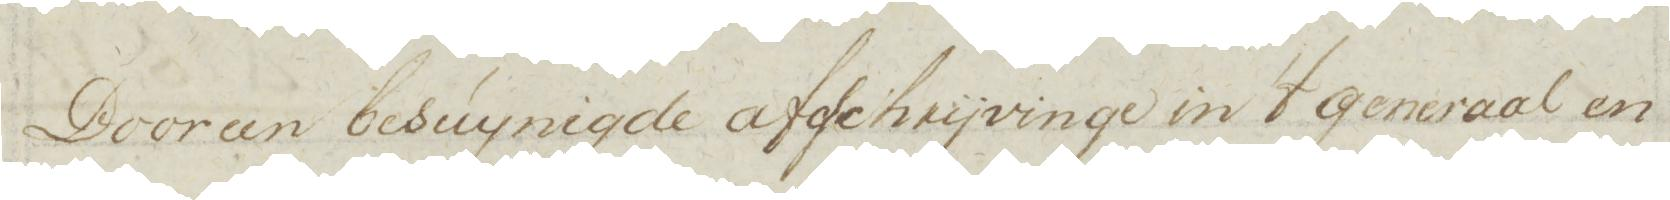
Door een besuijnigde afschrijvinge in ’t generaal en
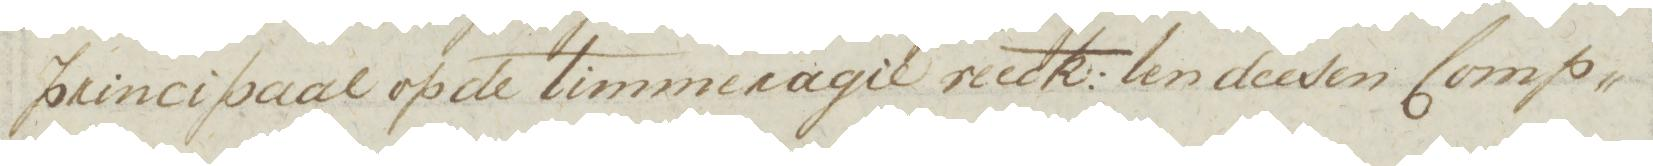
principaal op de timmeragie reeck: ten deesen Comp„
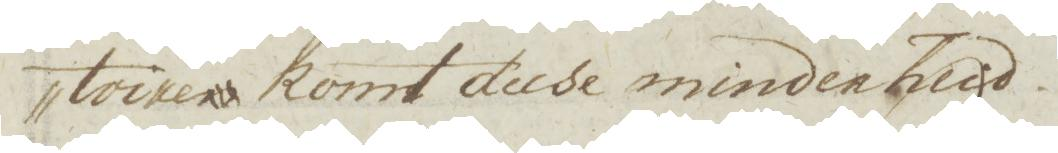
„toiren komt deese minderheid
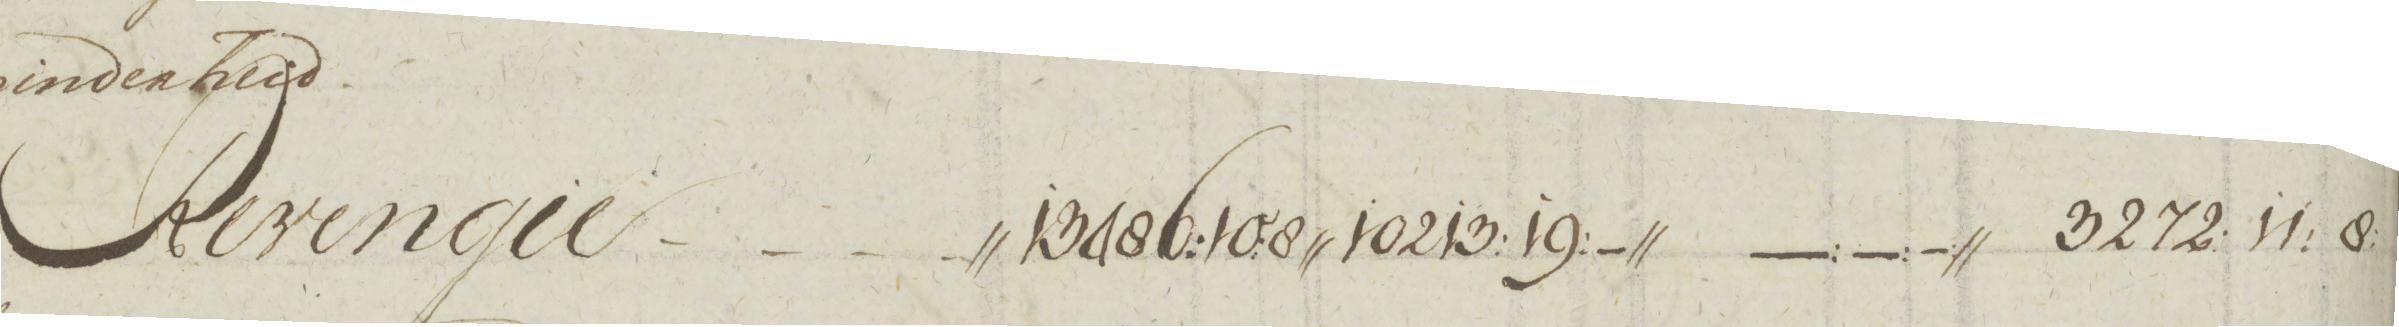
Revengie - - - -„ 13486:10:8 „ 10213:19: —„ —: —: -„ 3272: 11: 8:
